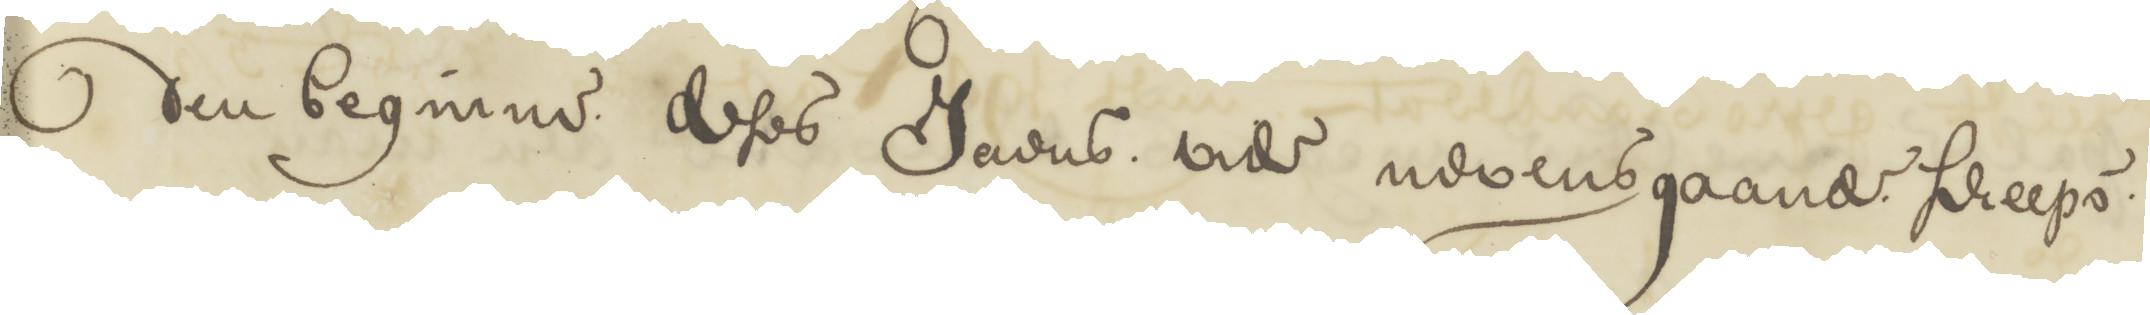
den beginne deses Jaers vide nevens gaande scheeps
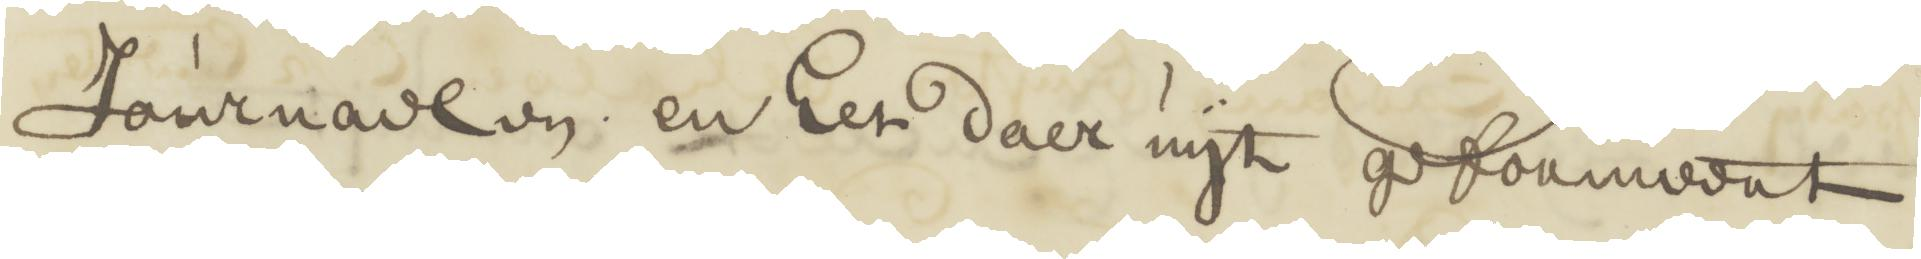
Iournaelen en het daer uijt geformeert
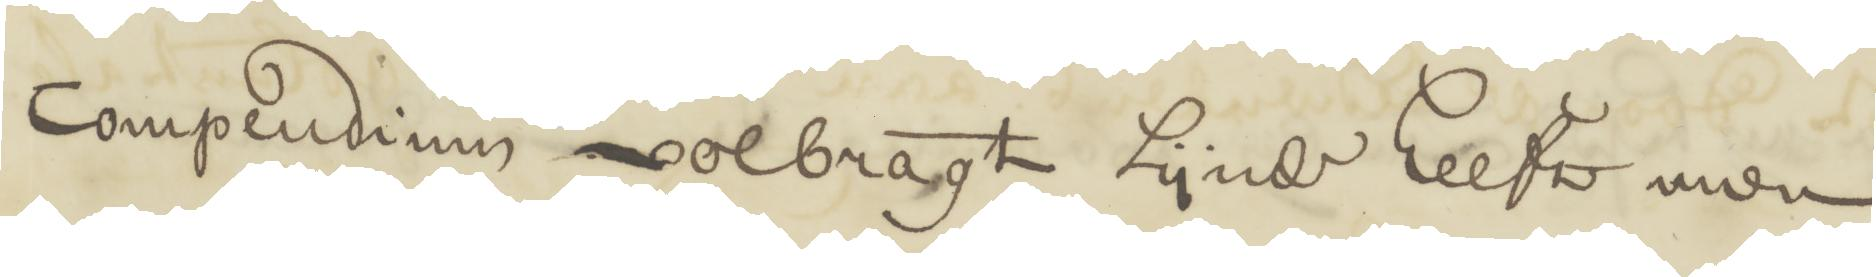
compendium volbragt sijnde heeft men
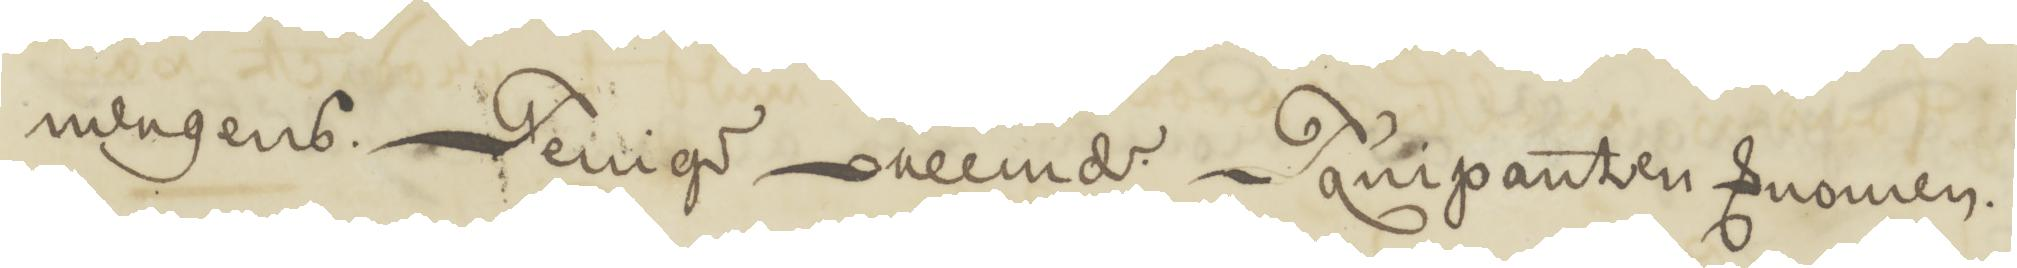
nergens. Eenige vreemde Equipanten vernomen.
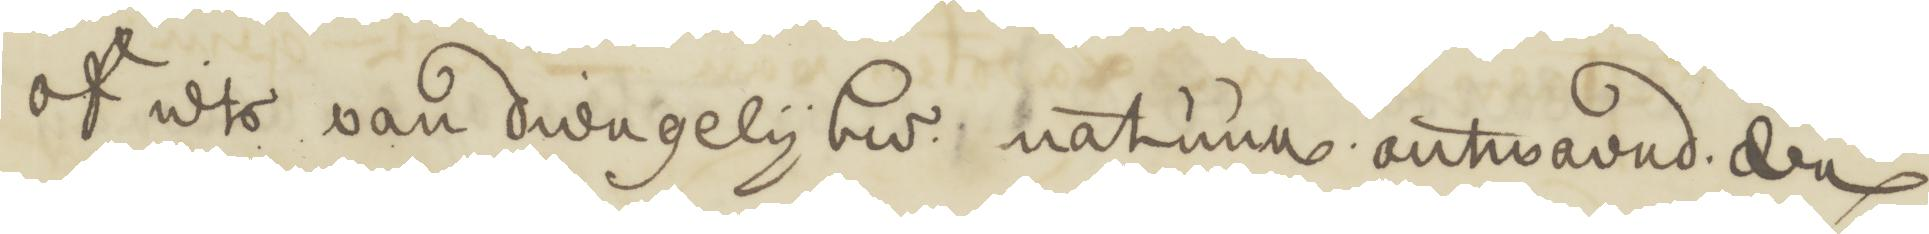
of iets van diergelijke natuur ontwaerd der
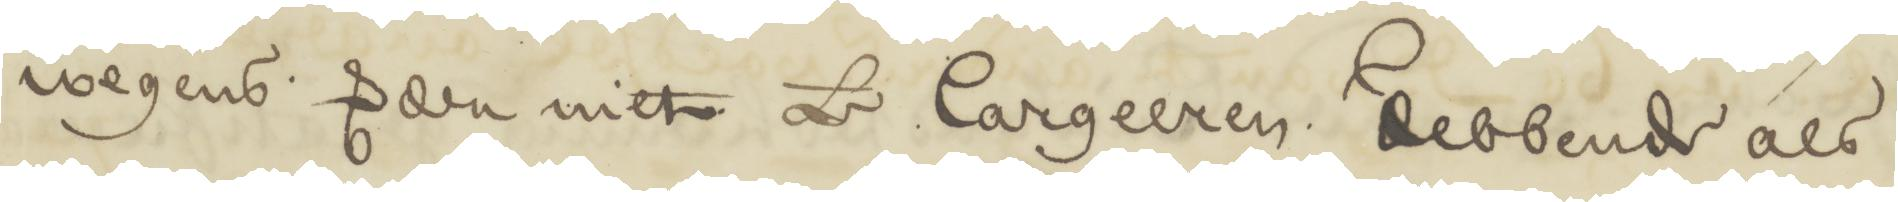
wegens verder niet te largeeren hebbende als
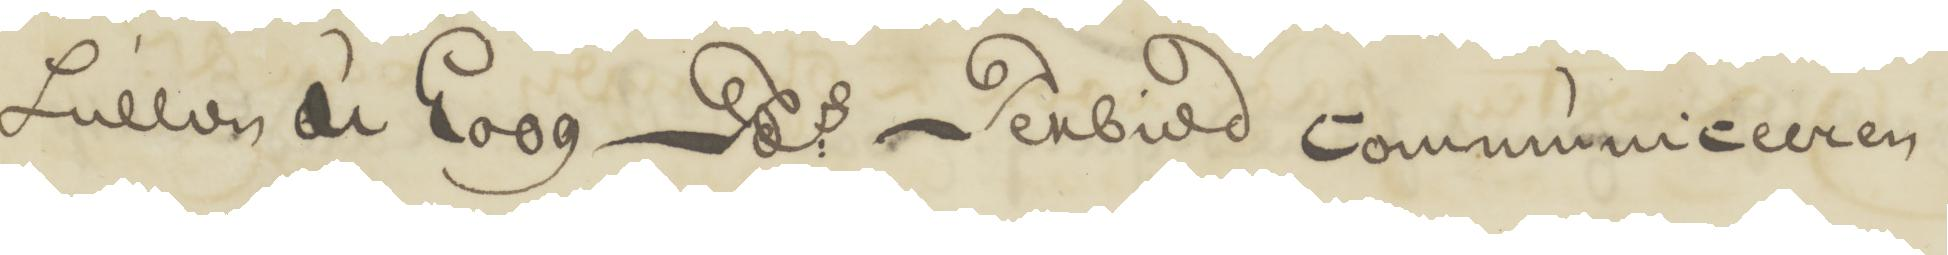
sullen de hoog Ed:s Eerbied communiceeren
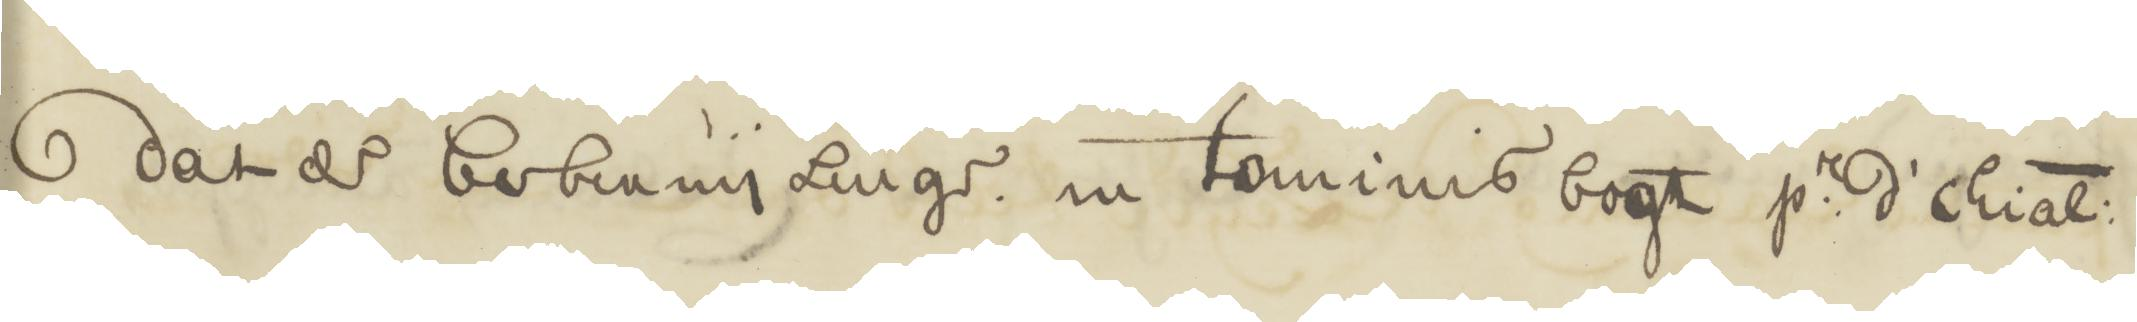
dat de bekruijsinge in tominis bogt p:r d’Chial:
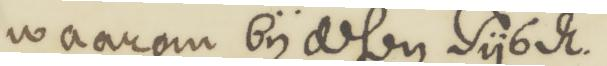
waarom bij desen Eijsch.
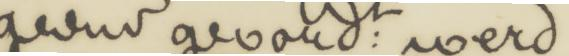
geene gevord:t werd
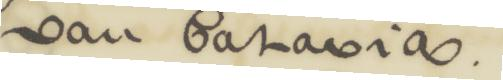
van batavia.
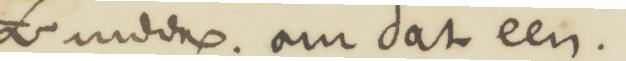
te meer om dat een.
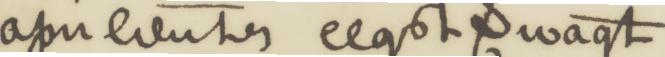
opulenten oogst verwagt
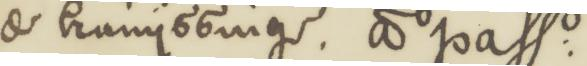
de kruijssinge. ao pass:o
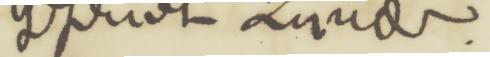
geschiet zijnde.
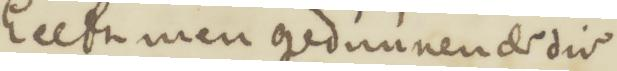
heeft men geduurende die
